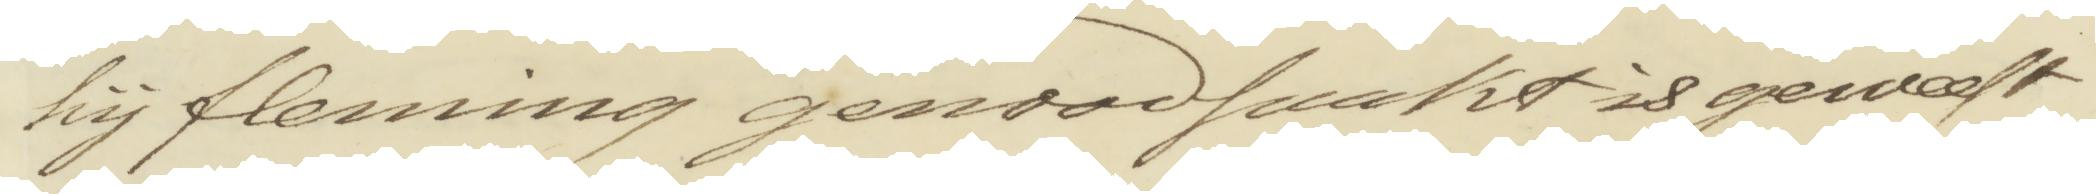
hij fleming genoodsaakt is geweest
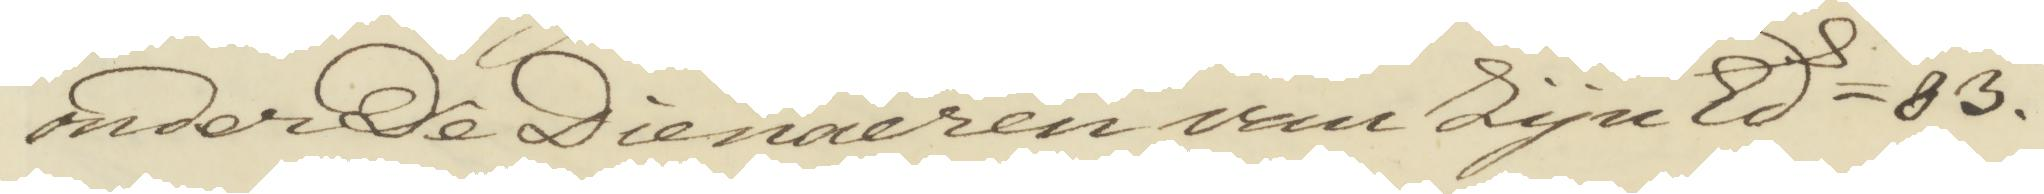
onder De Dienaeren van zijn Ed=s 83.
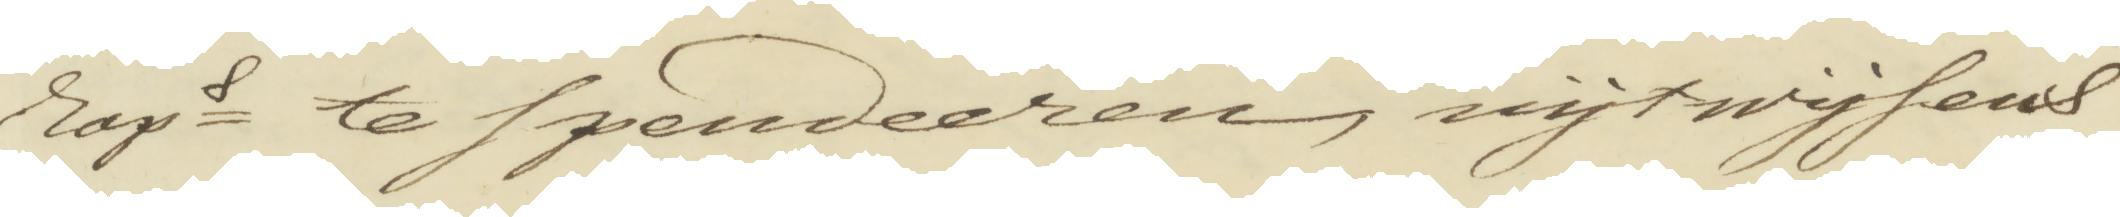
Rop=s te spendeeren, uijtwijsens
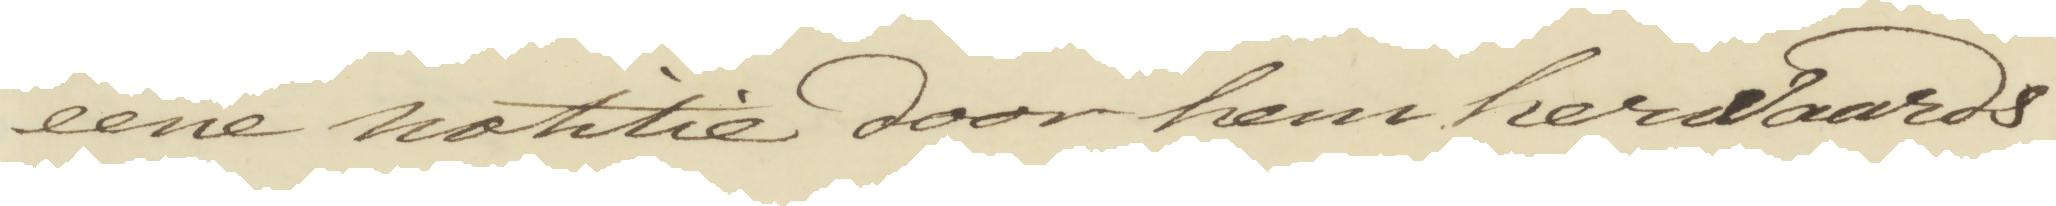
eene notitie door hem herwaards
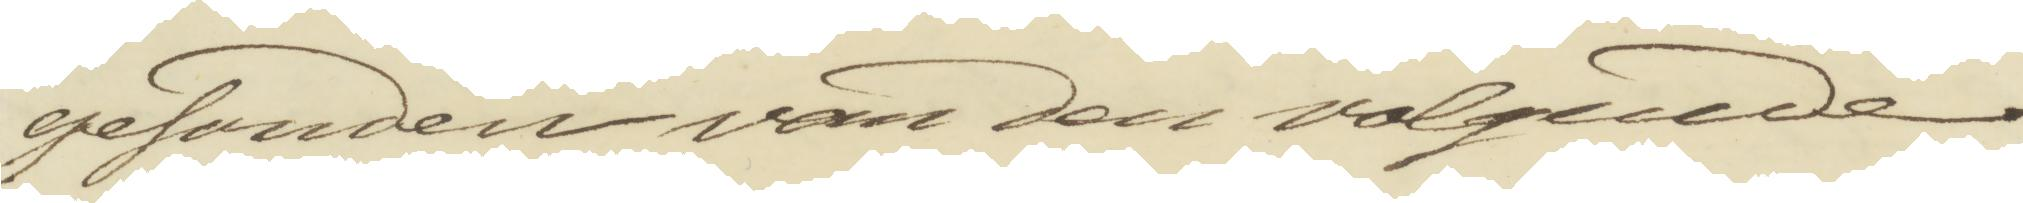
gesonden van den volgende
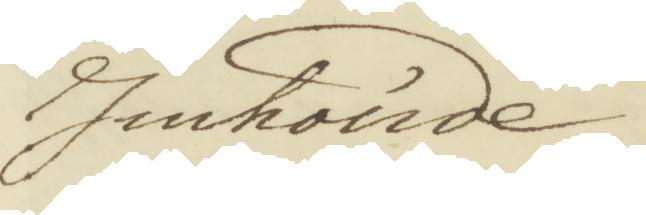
Jinhoude
